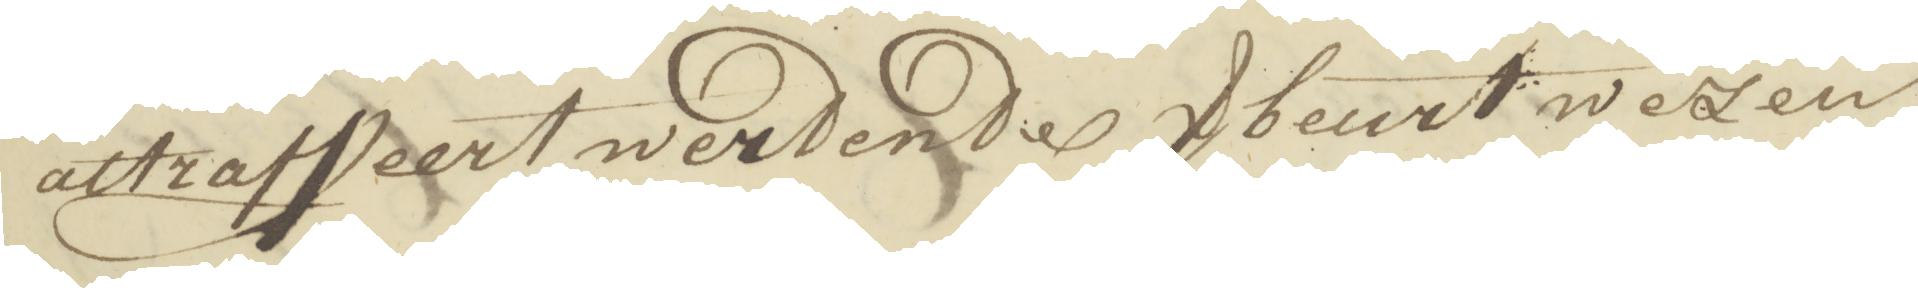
attrappeert werdende verbeurt wezen
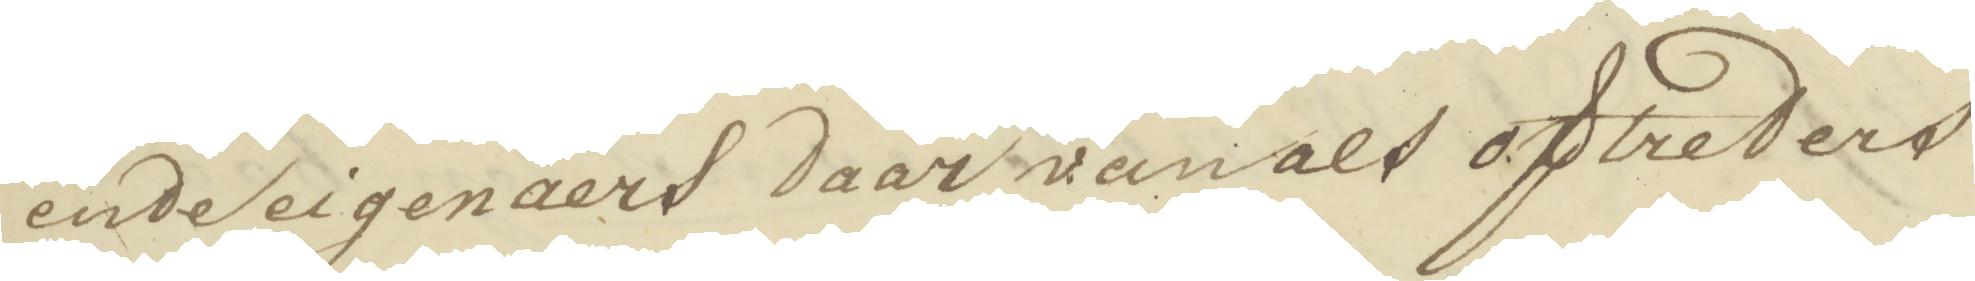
en de eigenaers daar van als overtreders
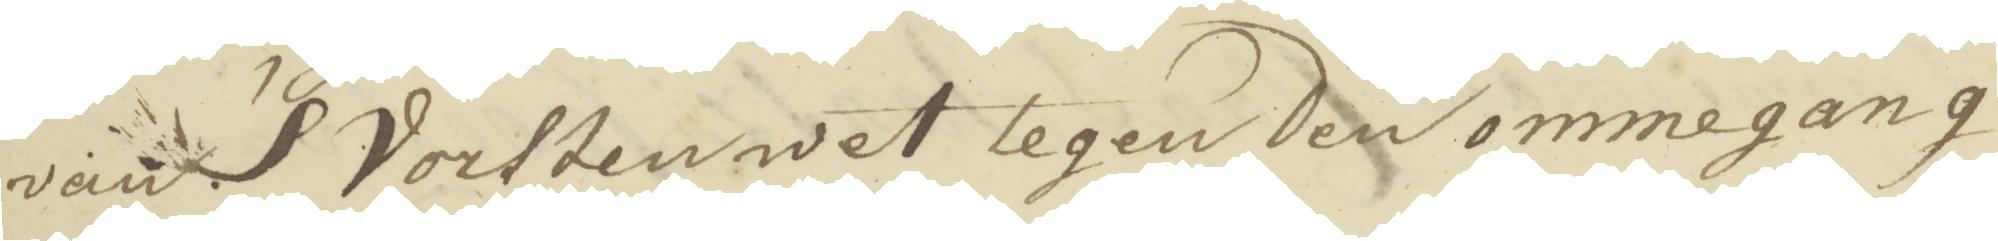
van 'S Vorsten wet tegen den ommegang
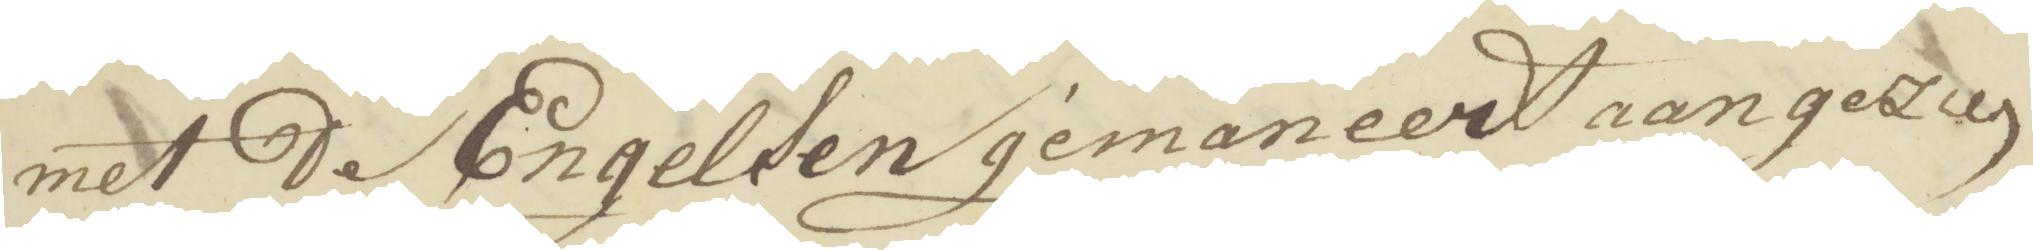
met de Engelsen gémaneert aangezien
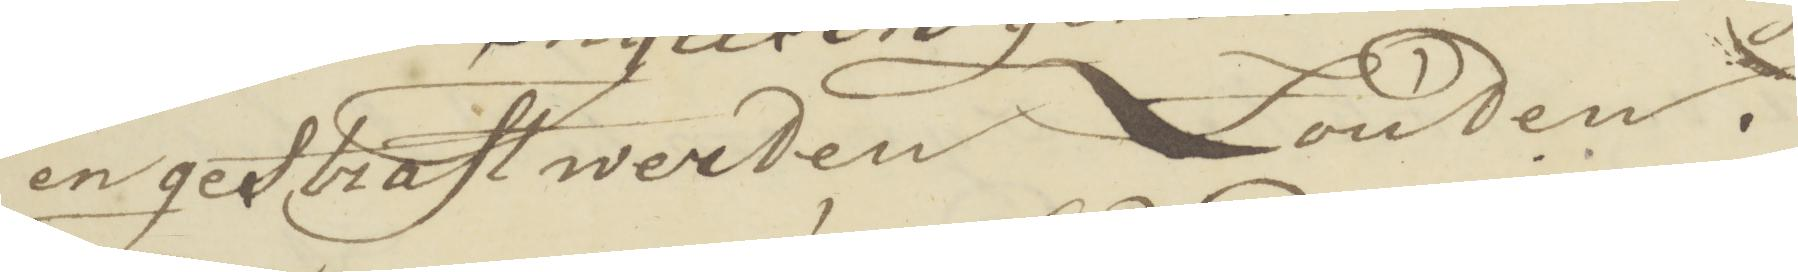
en gestraft werden Zouden.
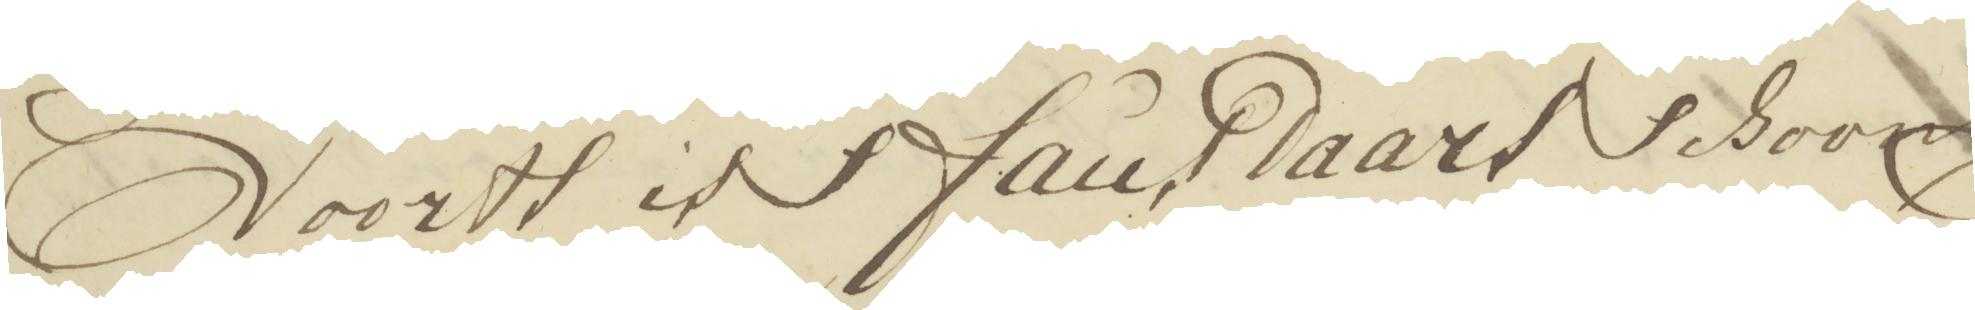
Voorts is 's fausdaars schoon
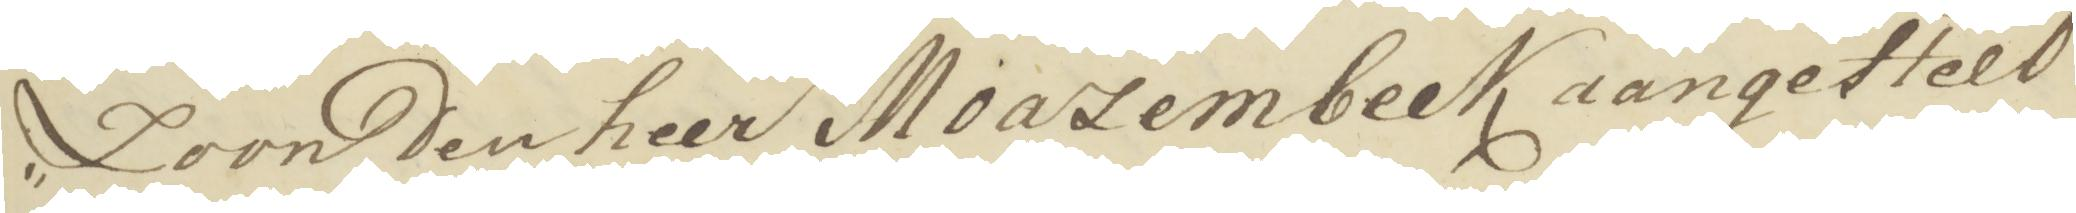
„Zoon den heer Moazembeek aangesteld
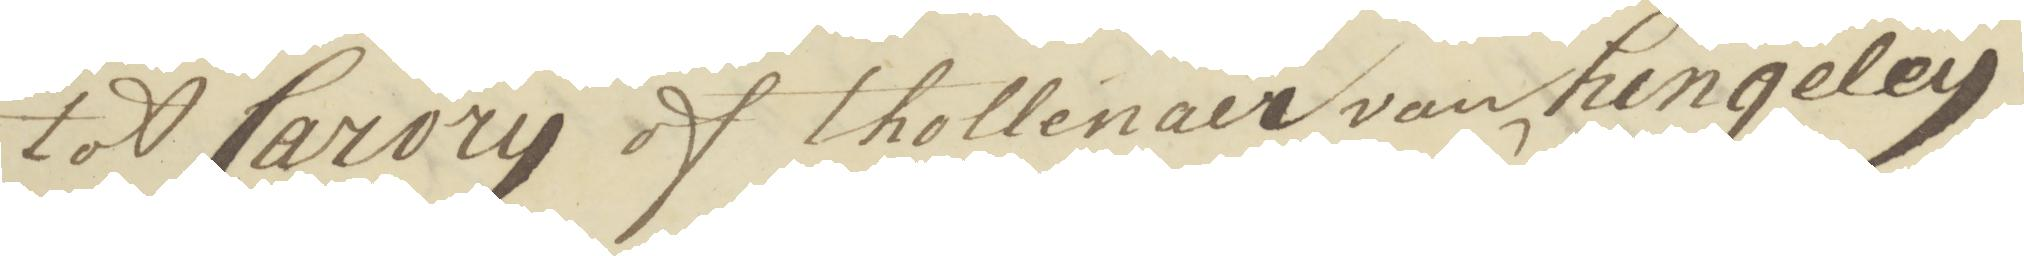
tot Carorij of thollenaer van hingeleij
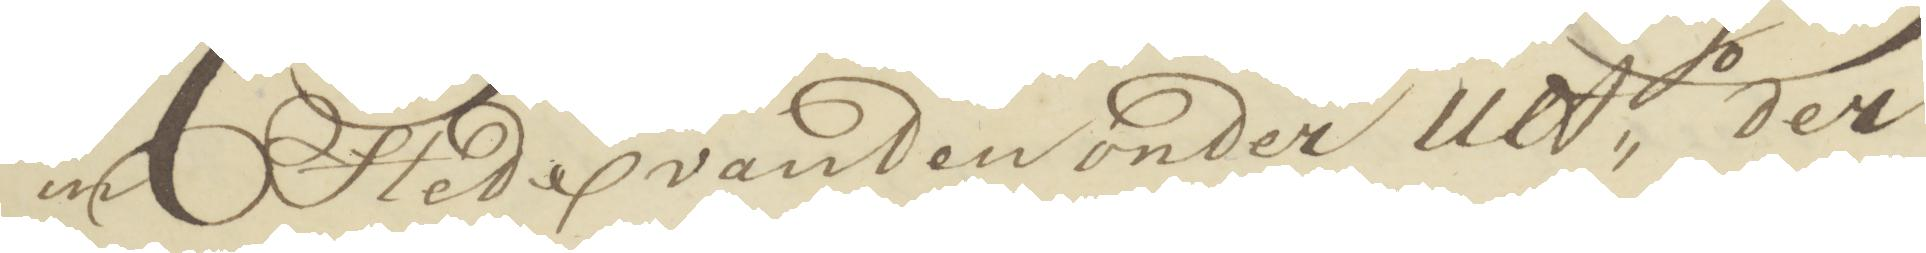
in Stede van den onder ult„o der
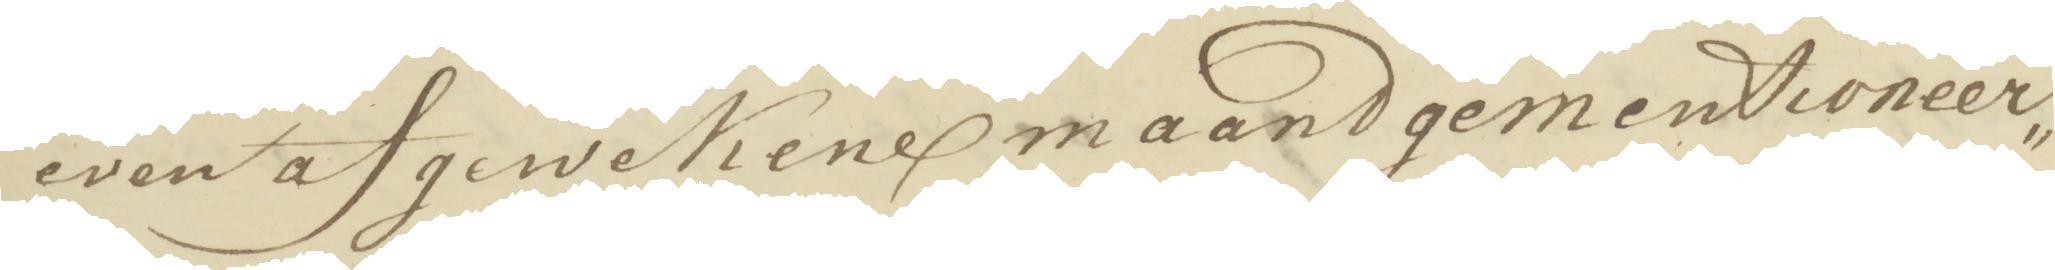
even afgewekene maand gementioneer„
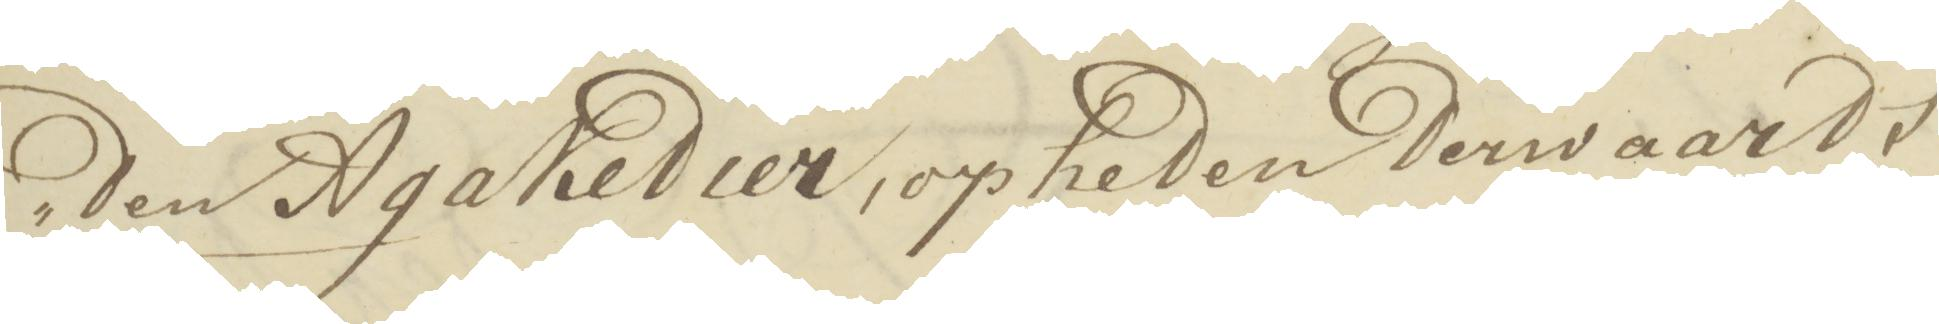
„den Agakedier, op heden derwaards
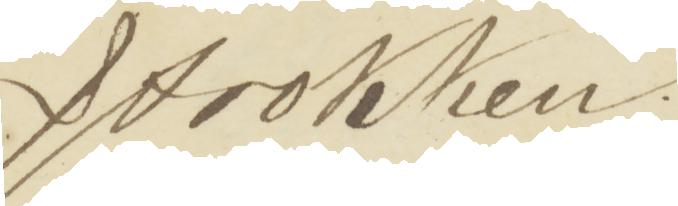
vertrokken.
